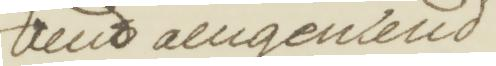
trend aengewend
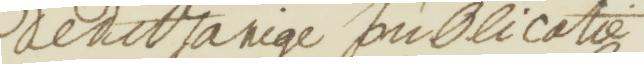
de ditJarige publicatie
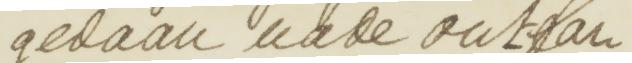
gedaan nade ontfan
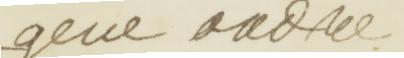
gene ordre
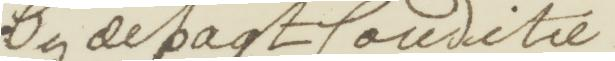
bij depagt Conditie
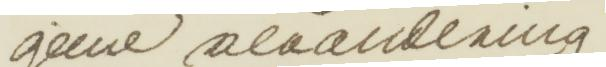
geene verandering
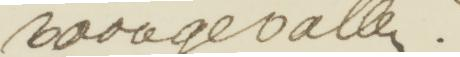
voor gevallen.
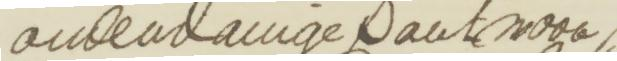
onderdanige verantwoor„
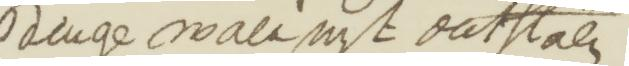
dinge waer uijt dat staen
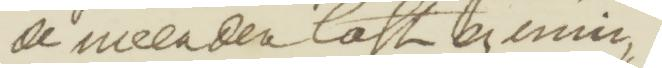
de meerder lasten min„
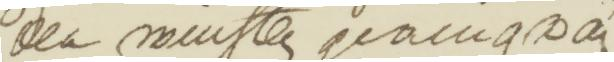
der winsten gering van
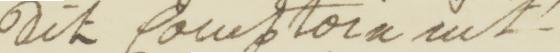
dit Comptoir in't
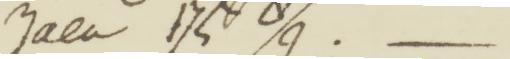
Jaer 1758/9. —
